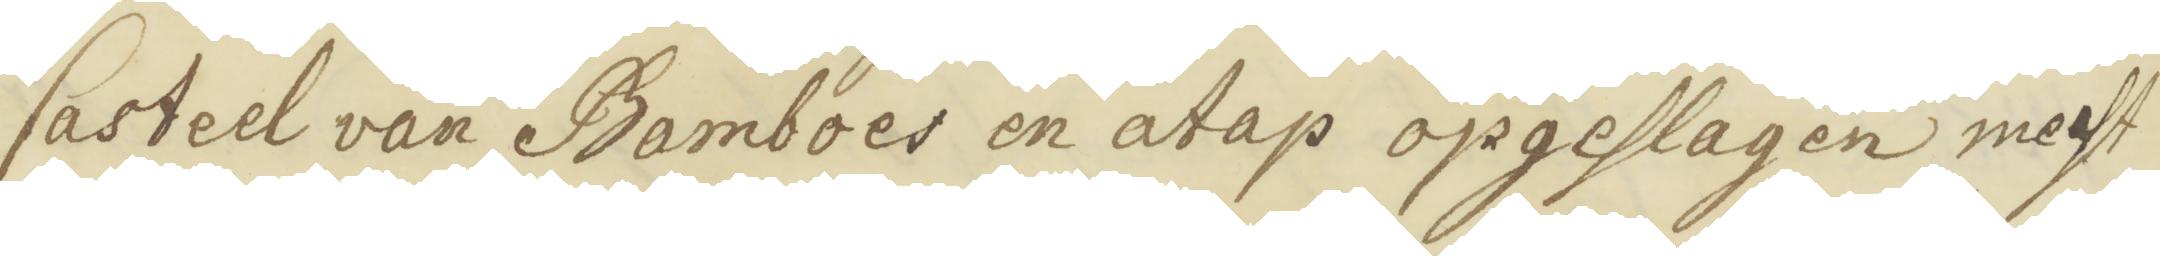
Casteel van Bamboes en atap opgeslagen meest
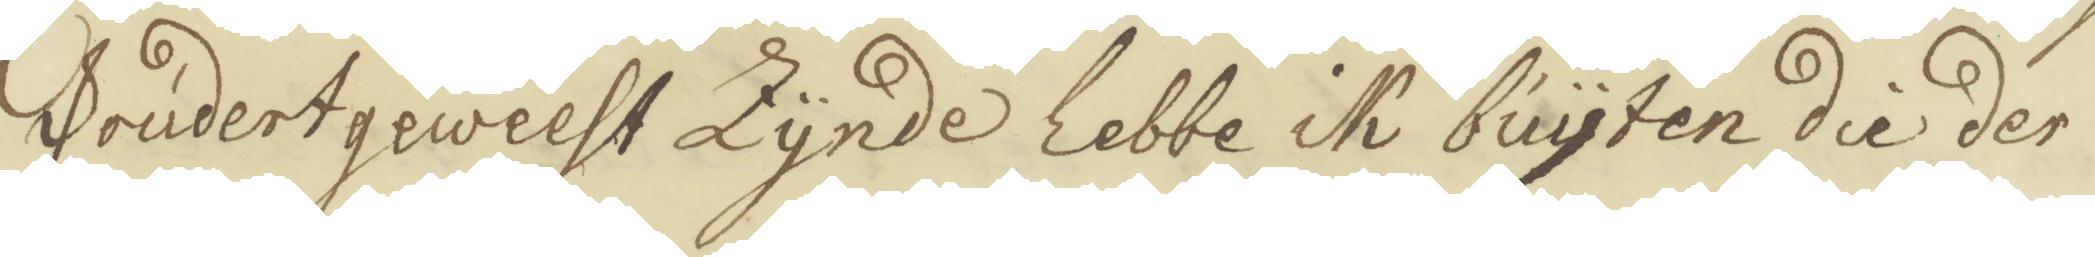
veroudert geweest Zijnde hebbe ik buijten die der
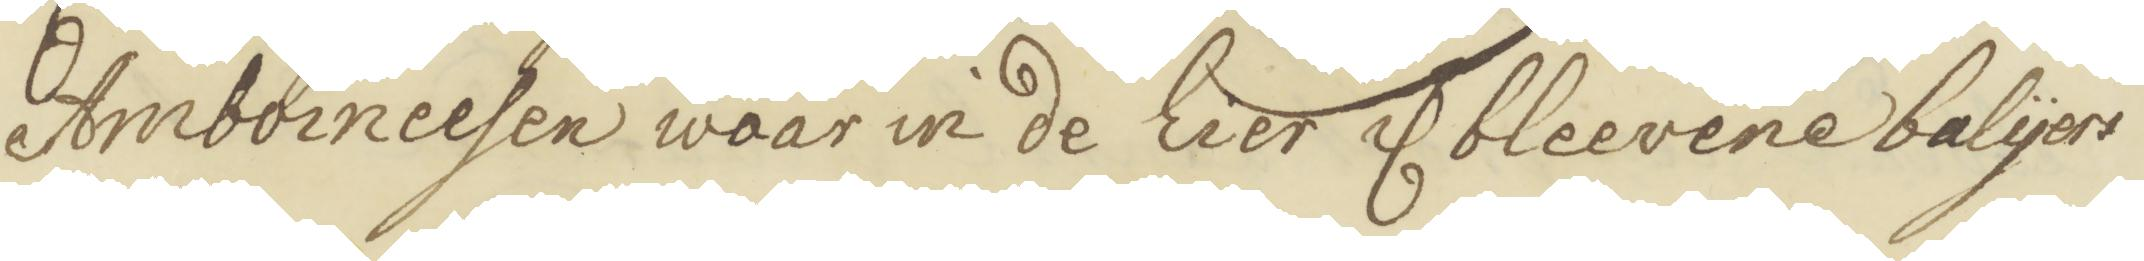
Amboineesen waar in de hier verbleevene balijers
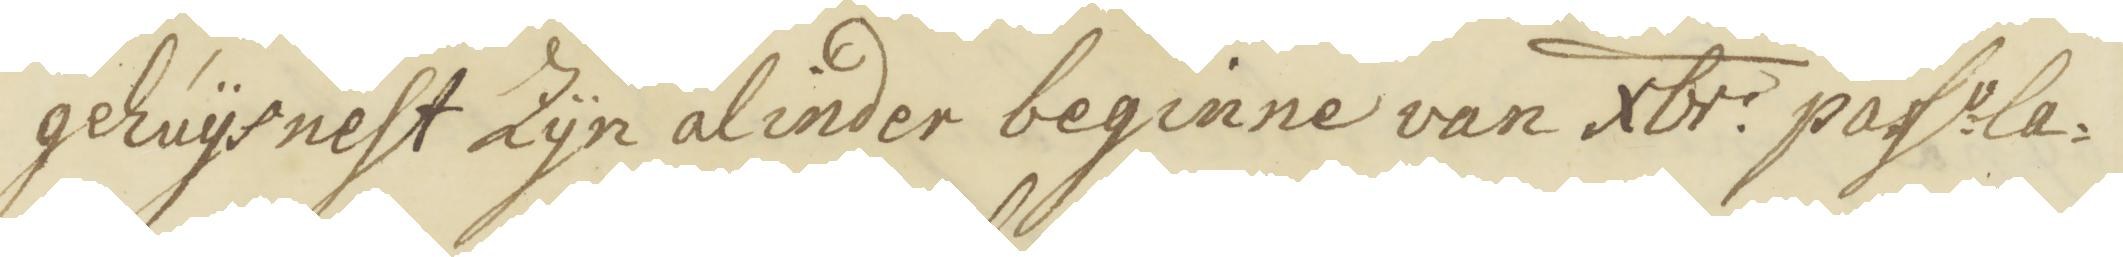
gehuijsvest Zijn al inder beginne van xbr: pas:o la:
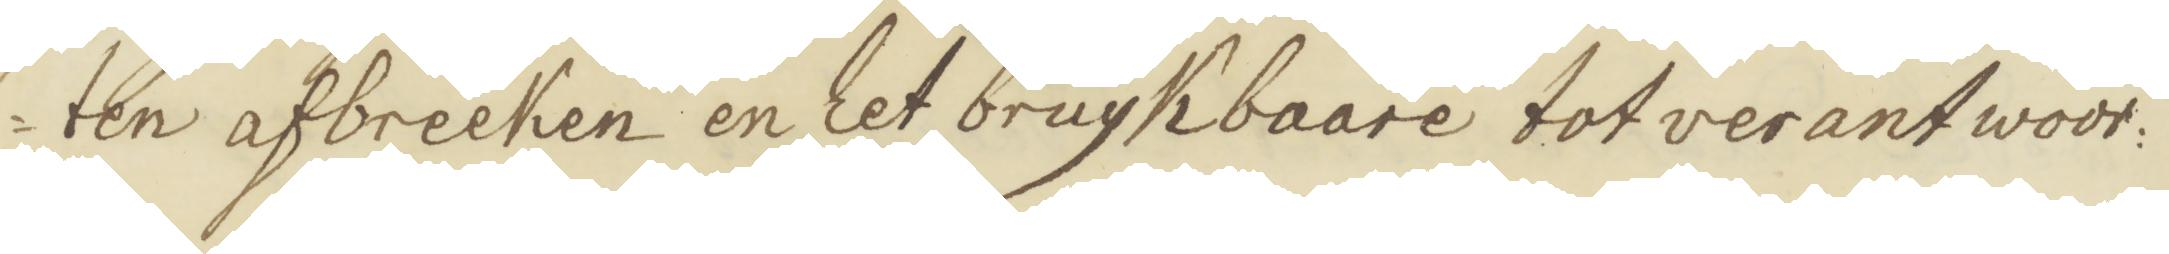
=ten afbreeken en het bruijkbaare tot verantwoor:
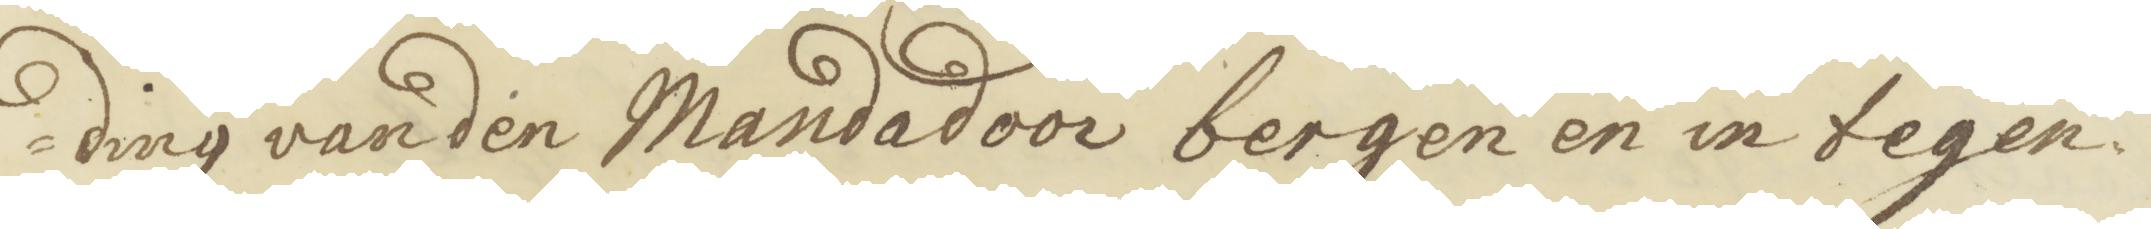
=ding van den Mandadoor bergen en in tegen:
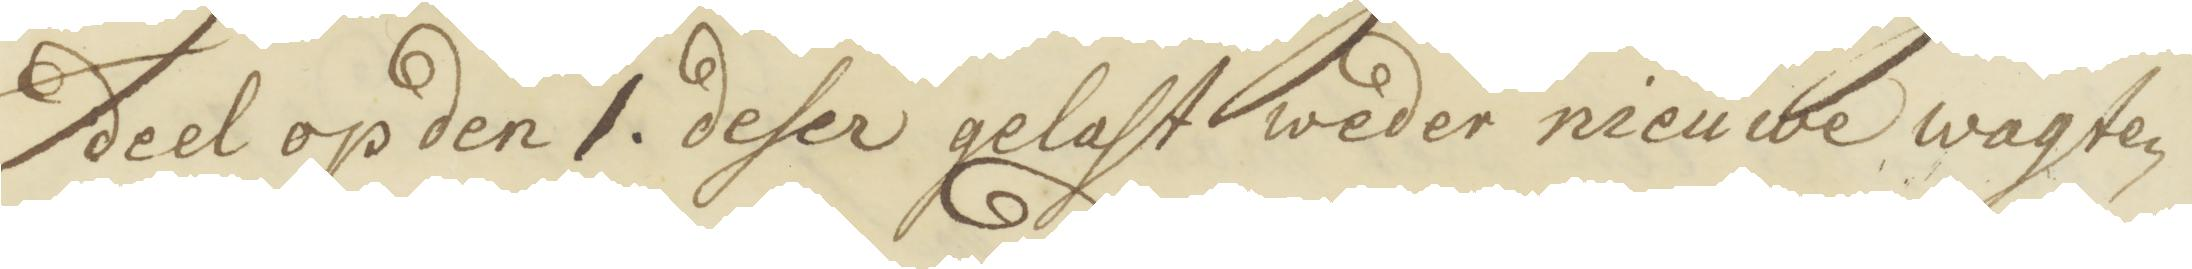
deel op den 1. deser gelast weder nieuwe wagten
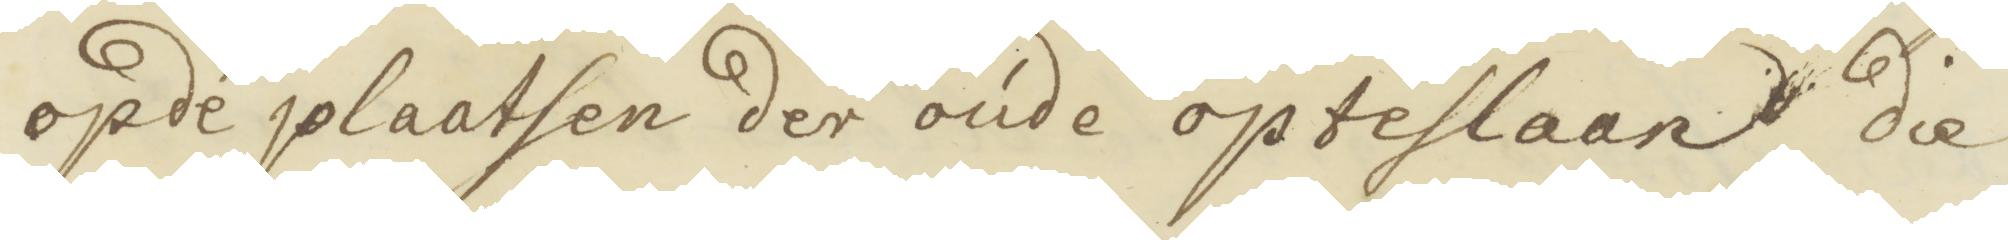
op de plaatsen der oude op teslaan die
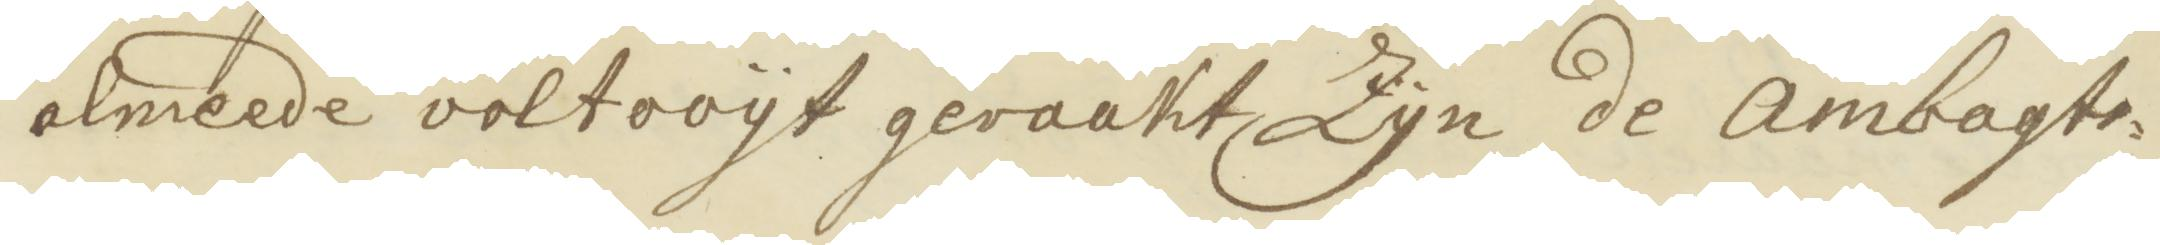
almeede voltooijt geraakt zijn de Ambagts=
